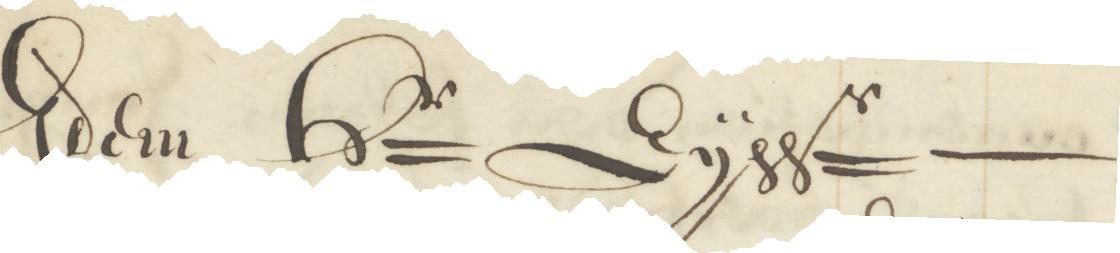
Idem H=r Eijss=r —
